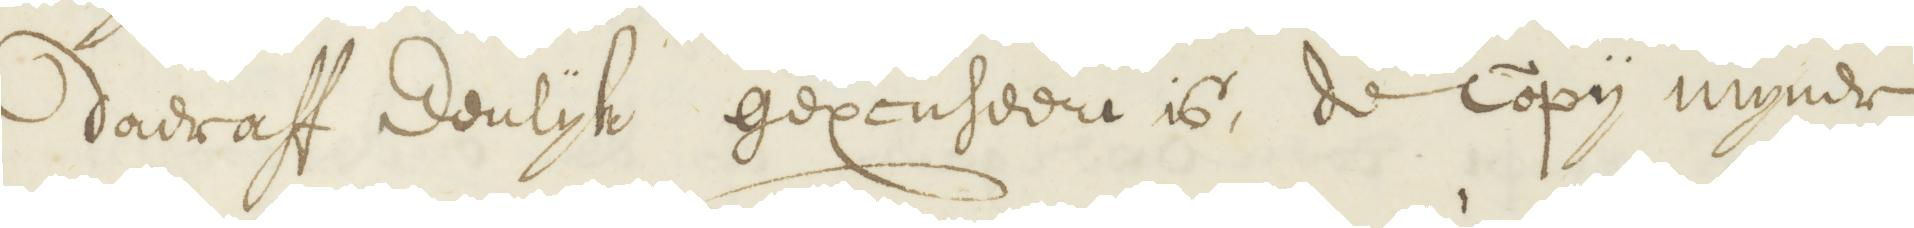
daeraff Eenlijk gexcuseert is, de Copij mijner
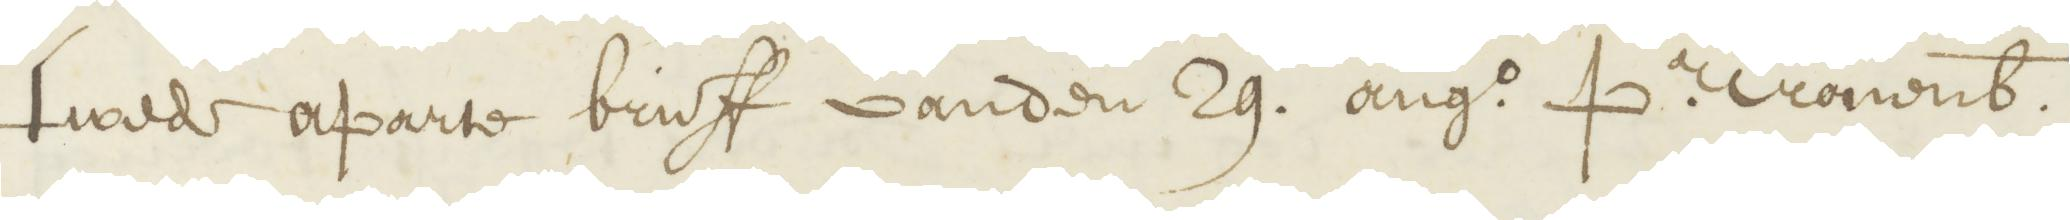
twede aparte brieff vanden 29. aug.o P.r Cronenb.
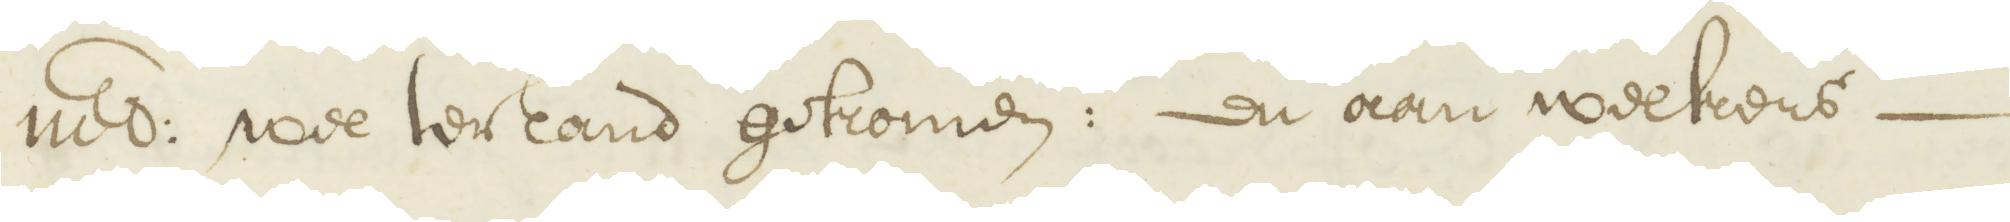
uEd: wel terhand gekomen: en aan welkers —
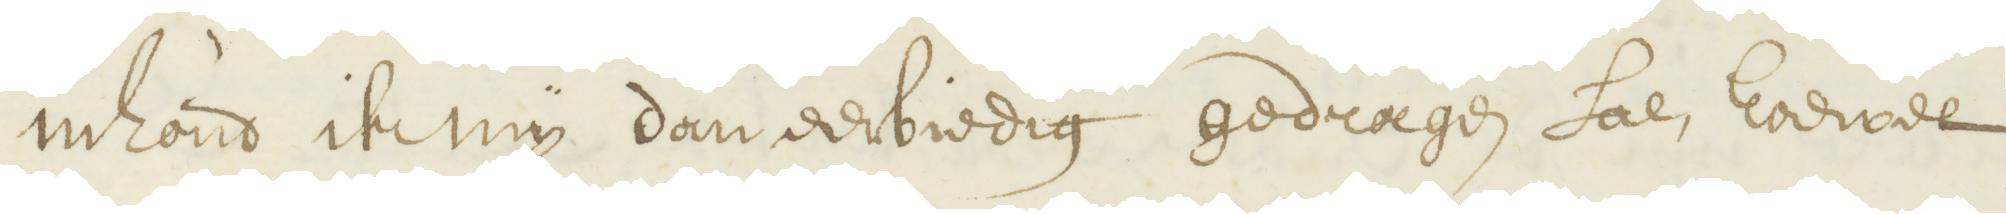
inhoud ik mij dan eerbiedig gedragen sal, hoewel
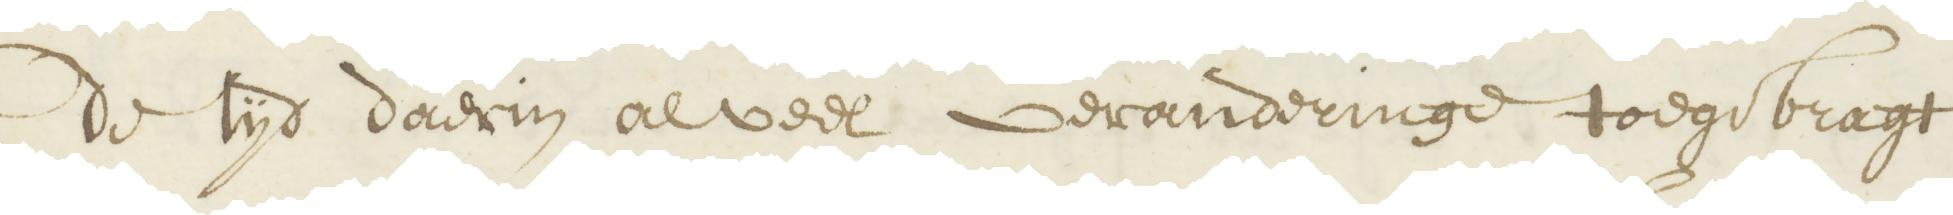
de tijd daerin alveel veranderinge toegebragt
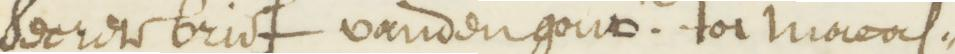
secrete brief vanden gouv.r tot Macas„
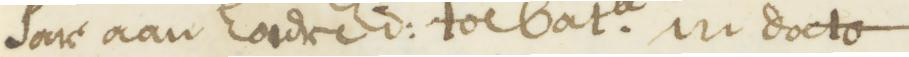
sar aan haer Ed: tot bat:a in dato
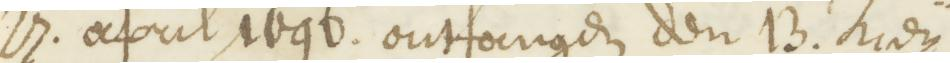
27. april 1696. ontfangen den 13. Meij
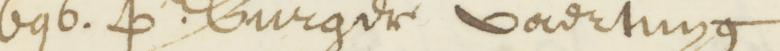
1696. P:r burger vaertuijg
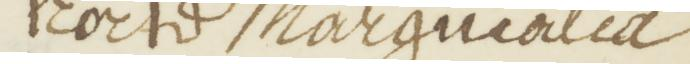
Korte Marginalia
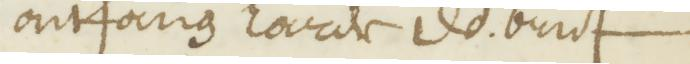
ontfang harer Ed. brief
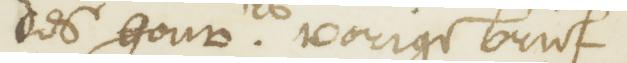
des gouv:rs vorige brief
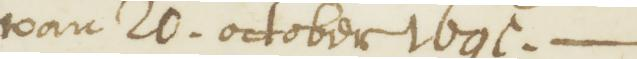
van 20. october 1695. —
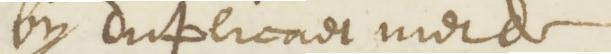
bij duplicaet met de
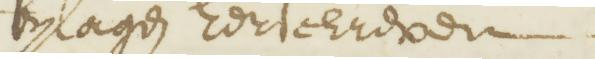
bijlagen herschreven
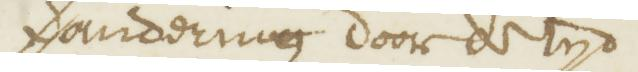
verandering door de tijd
